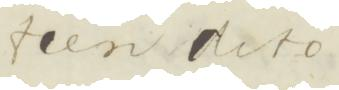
tien dito
